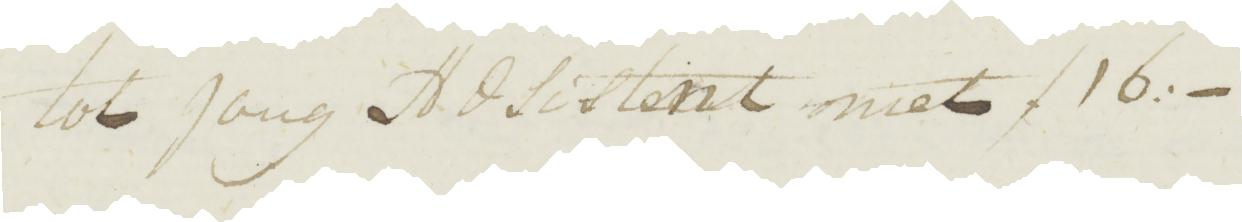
tot jong Adsistent met ƒ 16: —
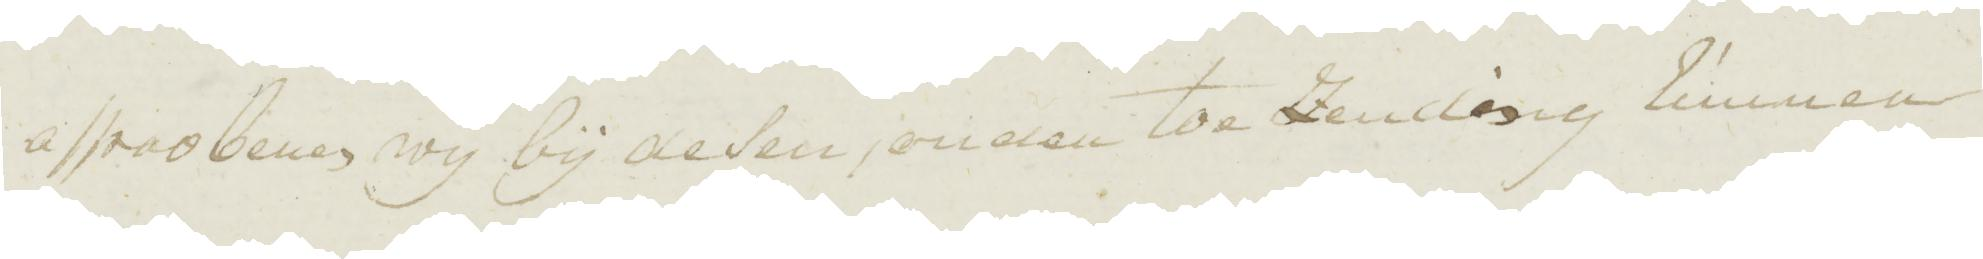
approberen wij bij desen, onder toe zending hunnen
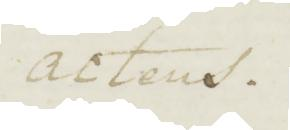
actens.
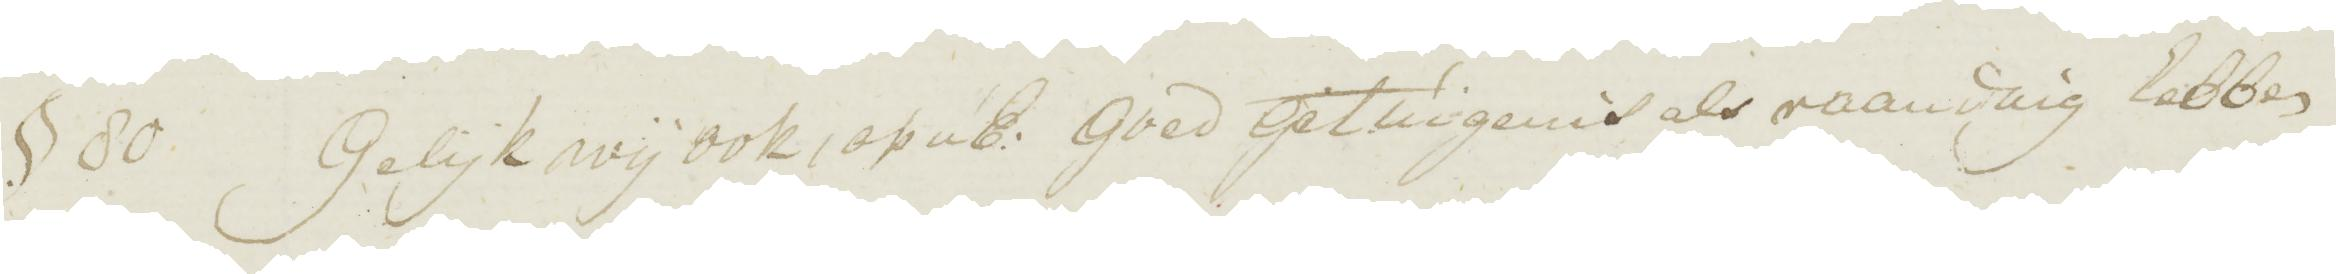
§ 80 Gelijk wij ook, op uE: goed getuigenis als vaandrig hebben
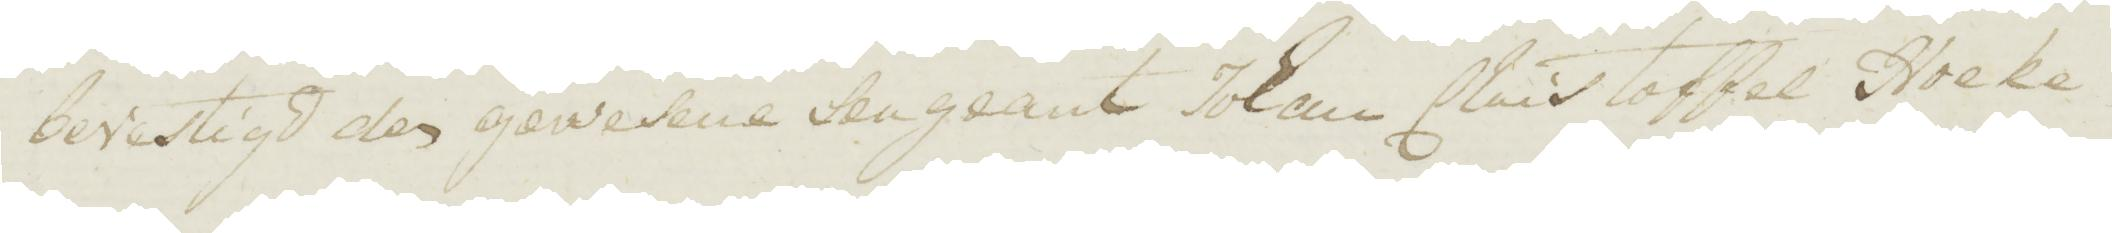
bevestigd den gewesene sergeant Iohan Christoffel Hoeke
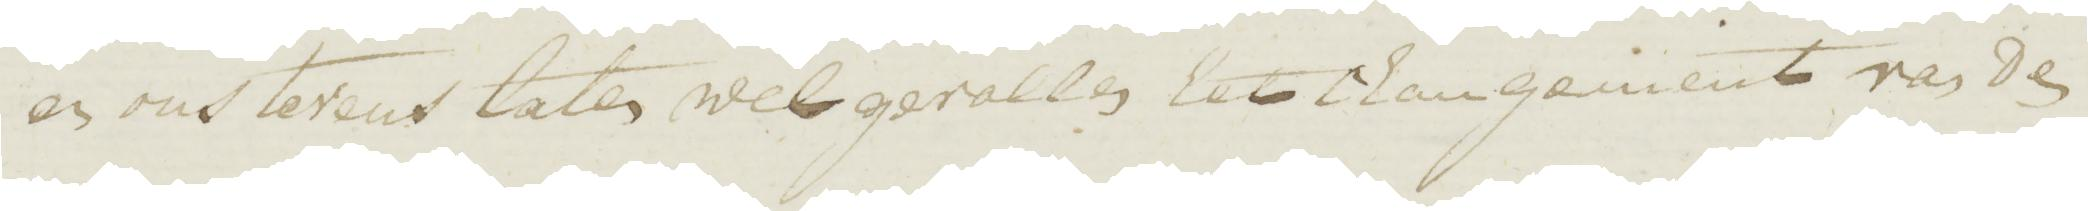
en ons tevens laten wel gevallen het changement van den
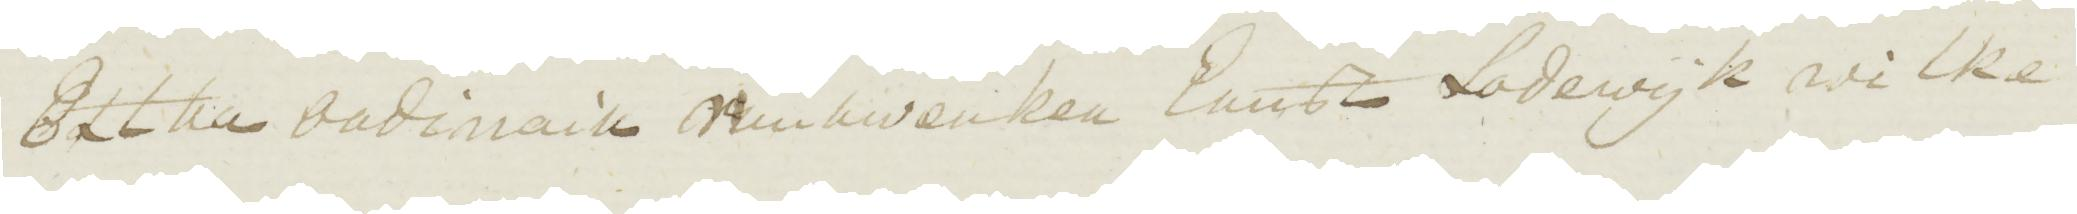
Extra ordinair vuurwerker Ernst Lodewijk wilke
